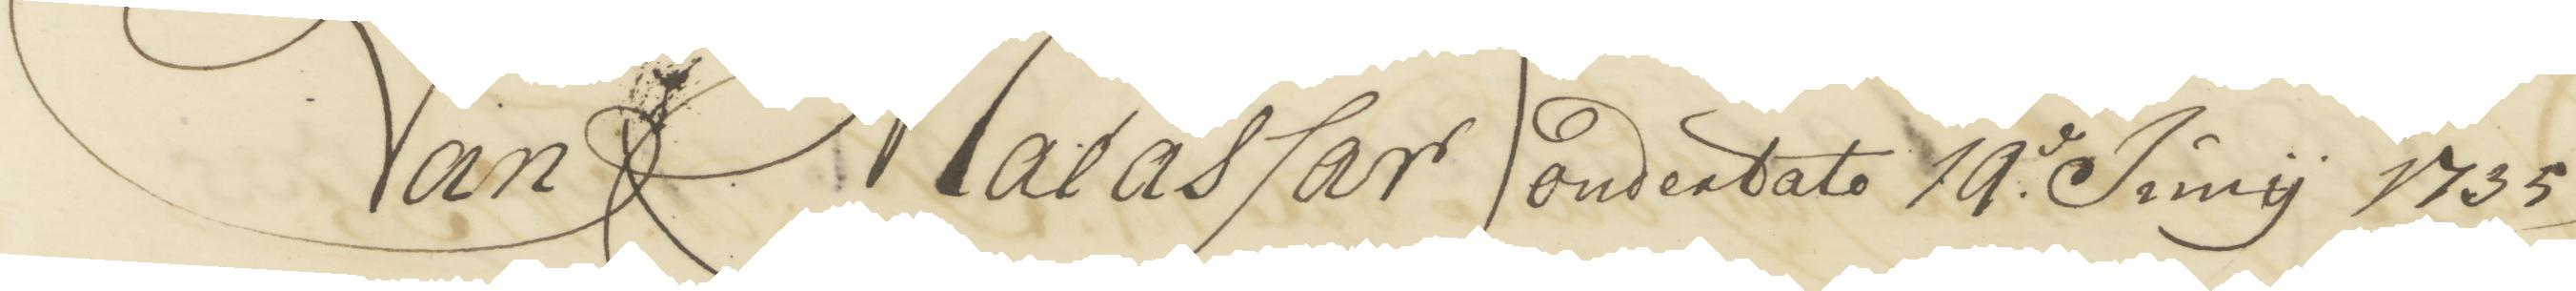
Van Macassar onder dato 14:e Iunij 1735
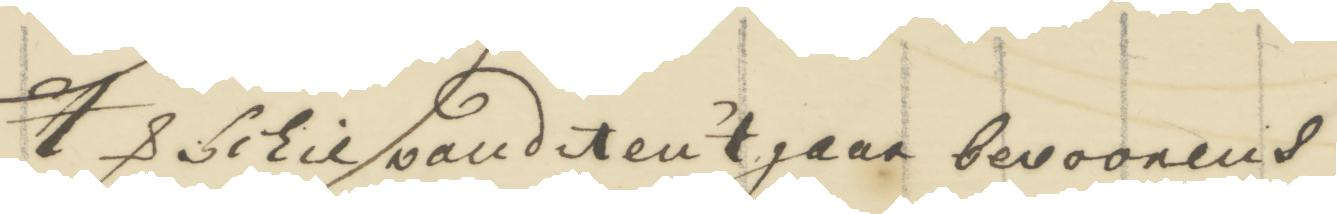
't verschil van dit en 't jaar bevoorens
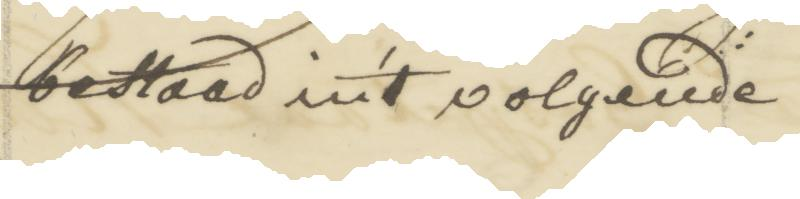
bestaad in’t volgende
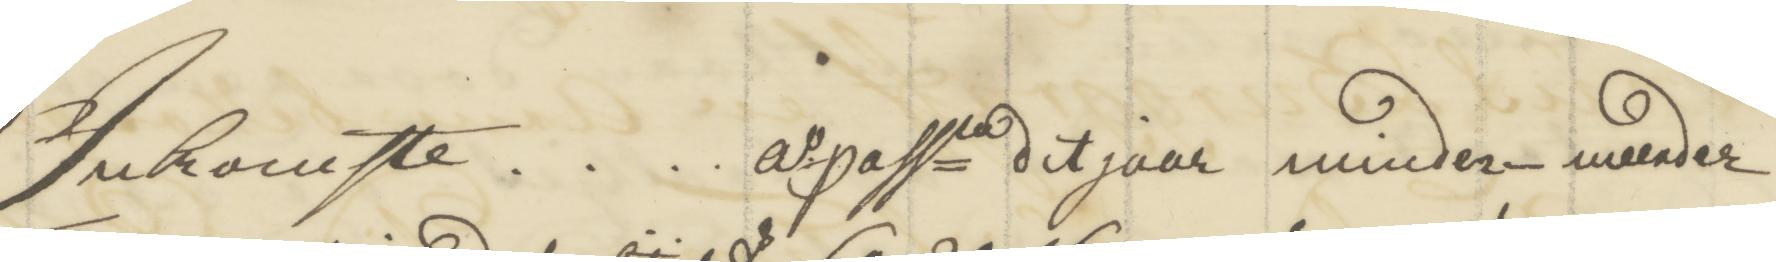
Jnkomste . . . . a:o pass=to dit jaar minder — meeder
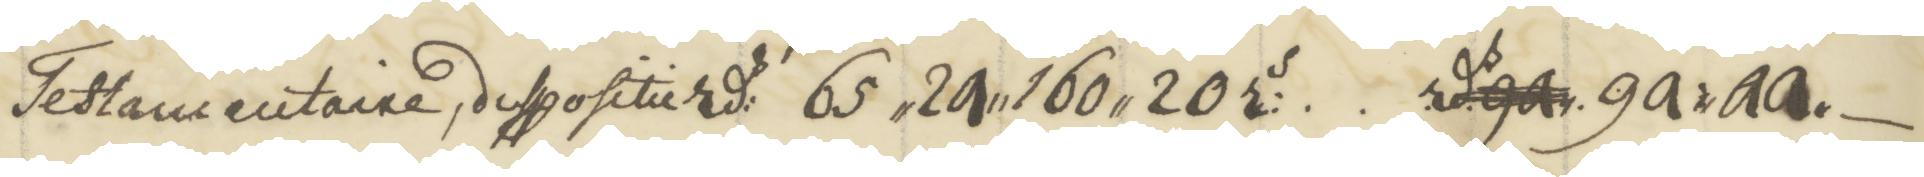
Testamentaire, dispositie rd:s 65 „24„160„20 r:s . . .rd:s94„. 94„44„ —
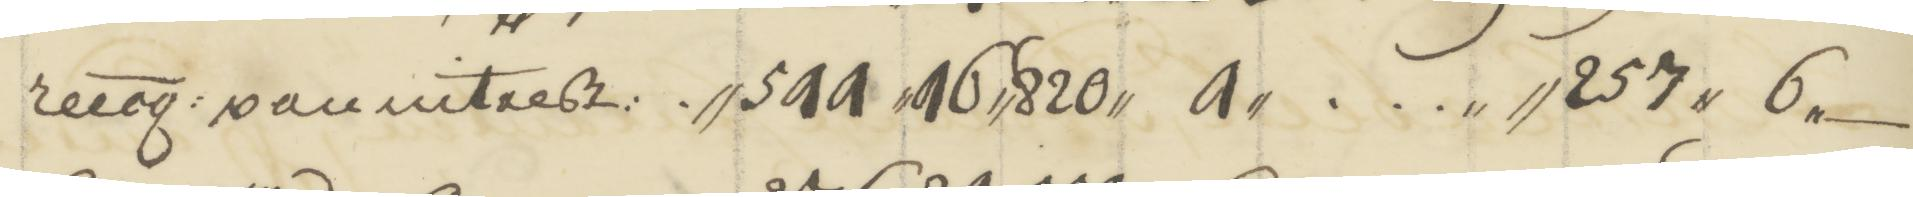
reecq: van intrest: . . „ 544 „46„820 „ 4 „ . . . „ „ 257 „ 6„—
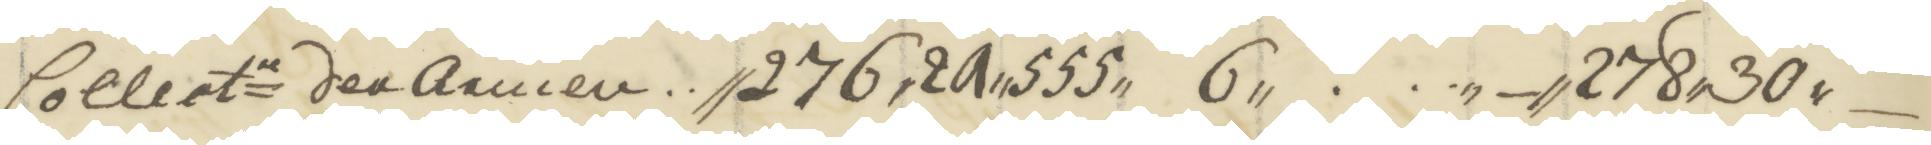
Collect=n der Armen . . „ 276„24„555„ 6„ . . . „—„ 278„30 „ —
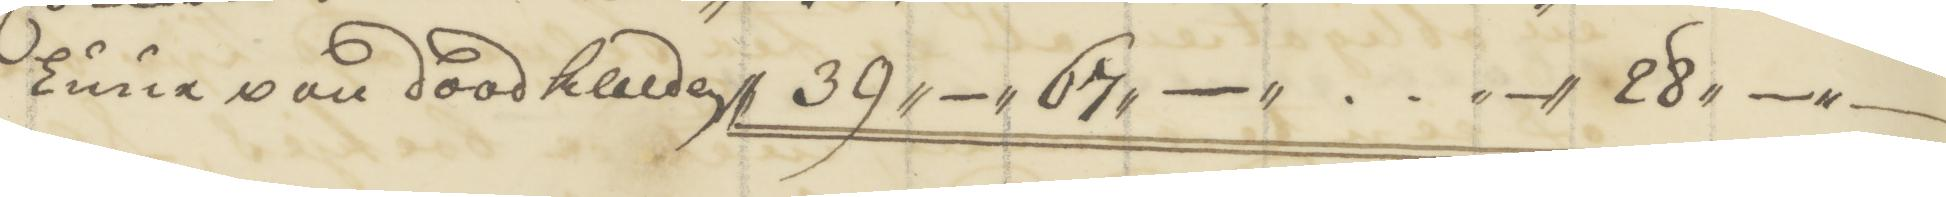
huur van dood kleeden „ 39 „ — „ 67 „ — „ . . „—„ 28 „ — „ —
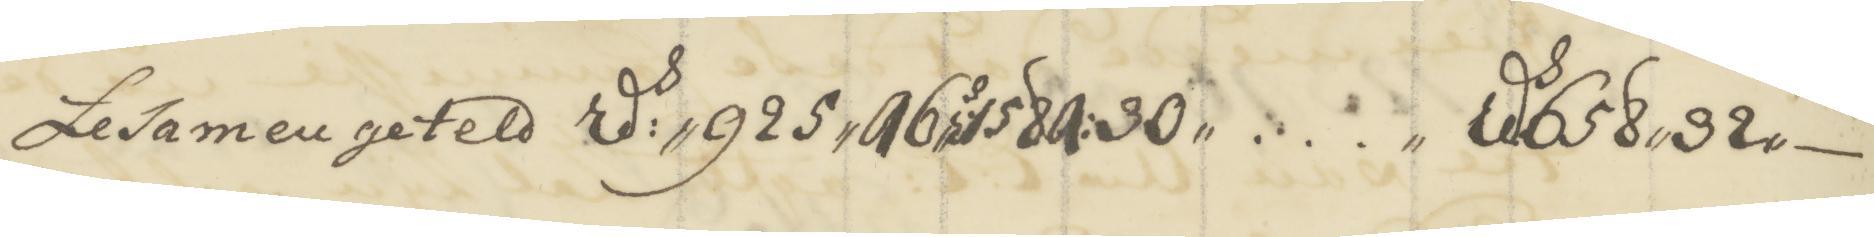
tesamen geteld rd:s „ 925„46„r:s1584:30„ . . . „ rd:s 658„32„ —
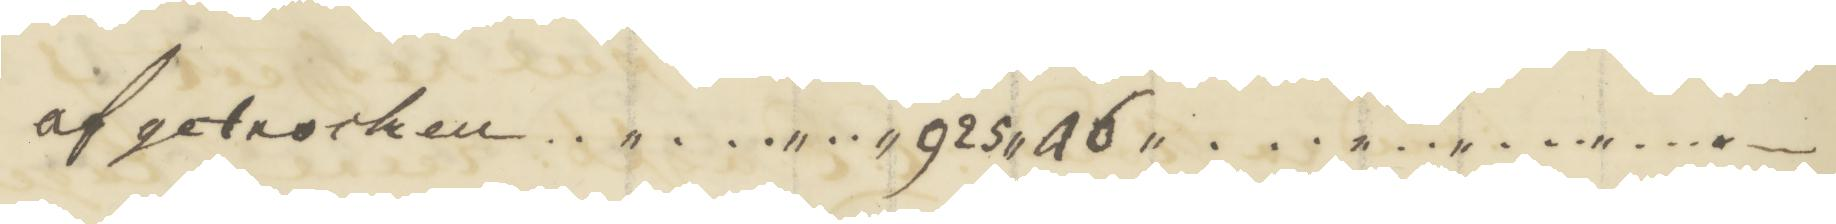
af getrocken . . „ . . . „ . . „925„46„ . . . „ . . „ . . . „ . . . „ —
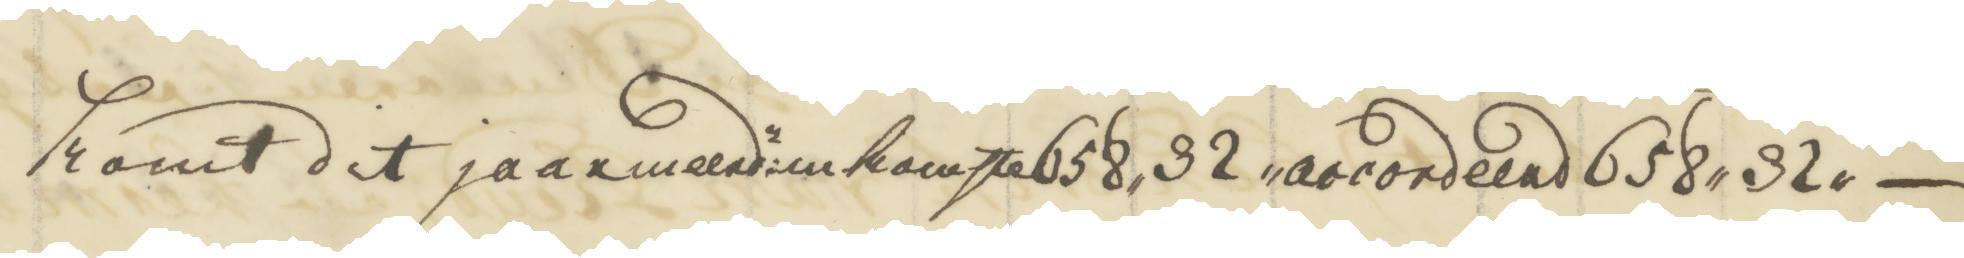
komt dit jaar meerd:r inkomste 658„32 „accordeerd 658„32„ —
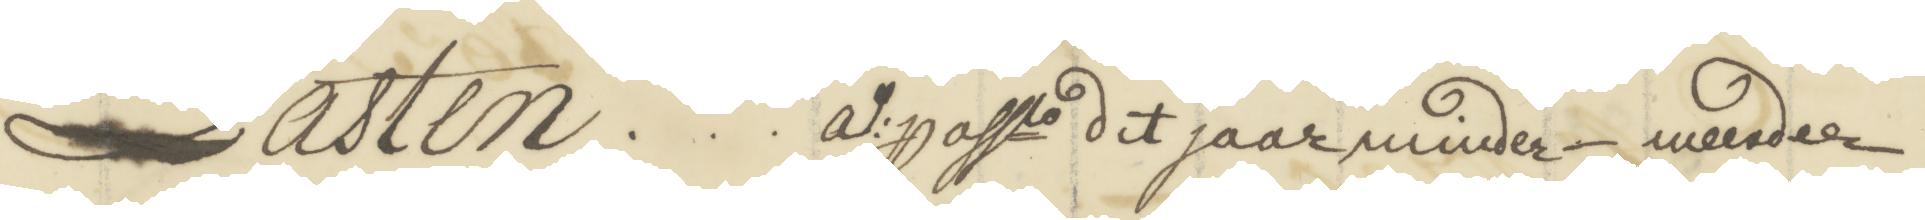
Lasten . . . a:o pass=to dit jaar minder — meerdeer
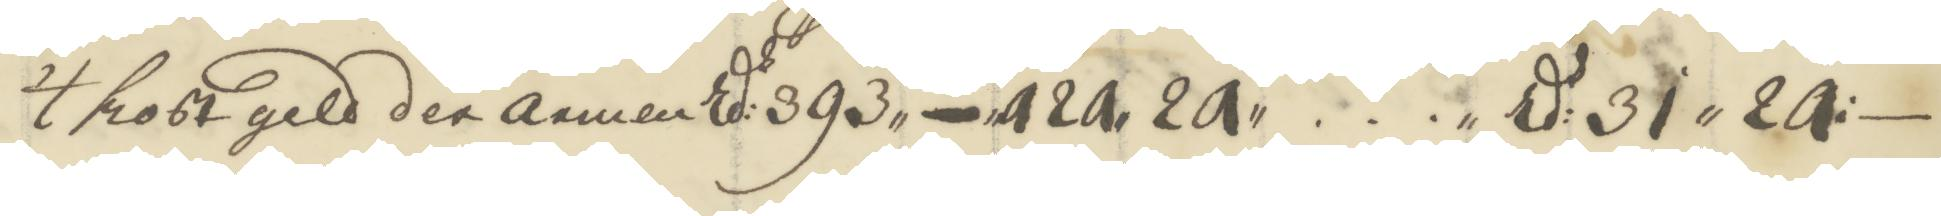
’t kost geld der armen rd:s 393„—„424„ 24„ . . . „ rd:s 31 „ 24: —
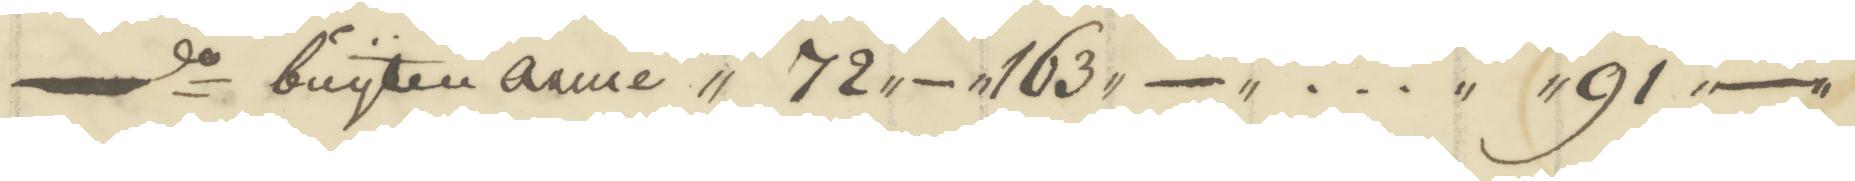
_=o buijten arme „ 72„—„163„ — „ . . . „ „91 „—„
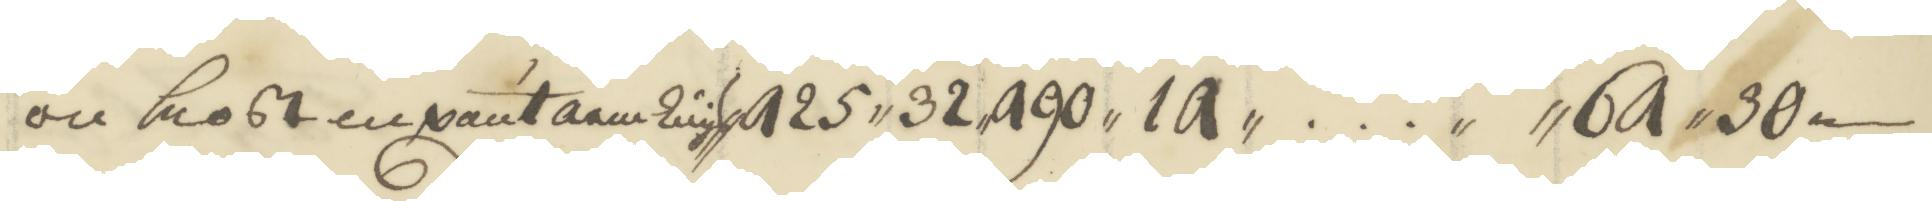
on kost en van't arm huijs„425„32„490„ 14 „ . . . „ „64„30„—
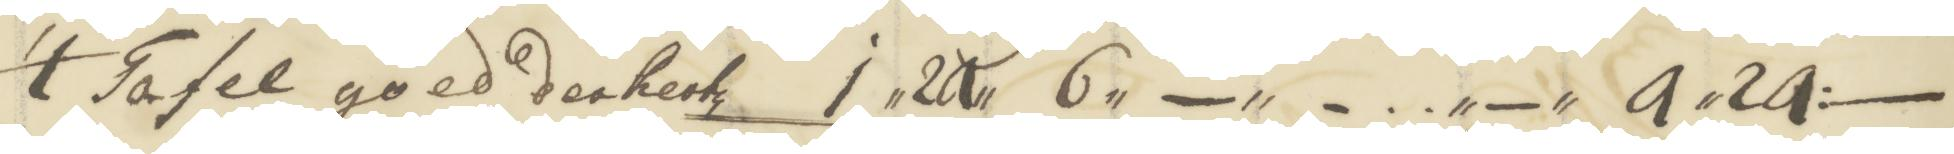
’t Tafel goed der kerk 1 „24„ 6„ —„ - . . „—„ 4 „24:—
